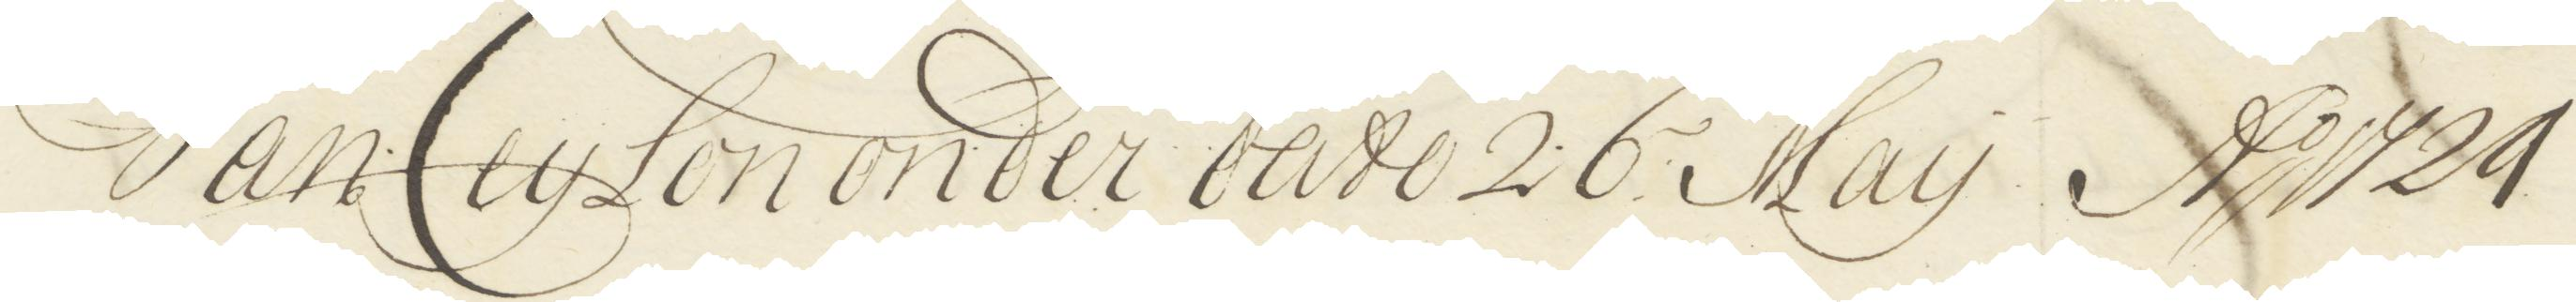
Van Ceijlon onder dato 26:' Maij: A„o 1724.
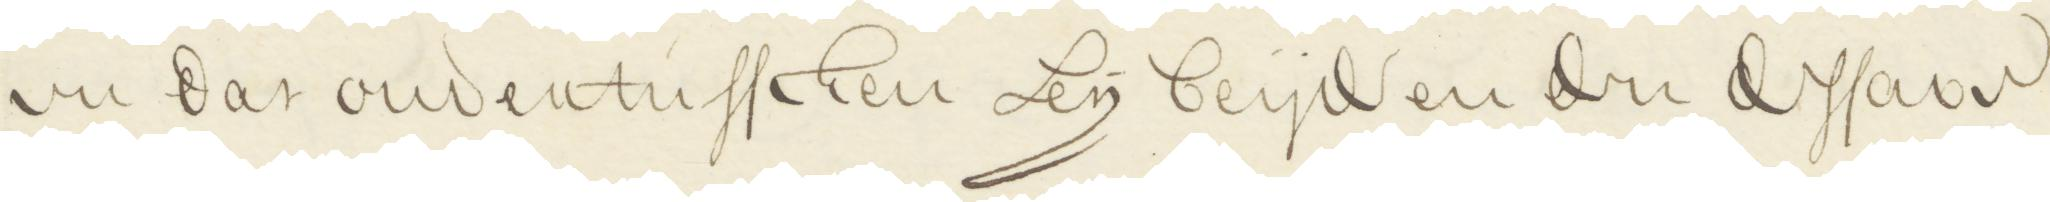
en dat ondertusschen seij beijde en den dessave
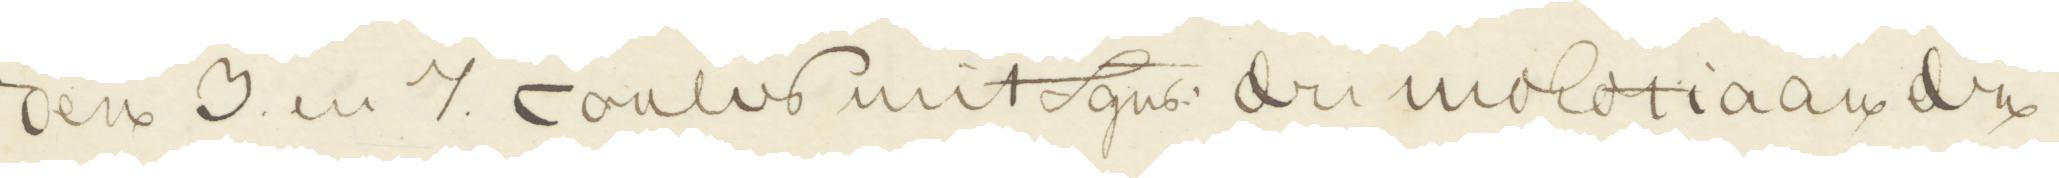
den 3. en 7. corles mitsgrs: den mohotiaar der
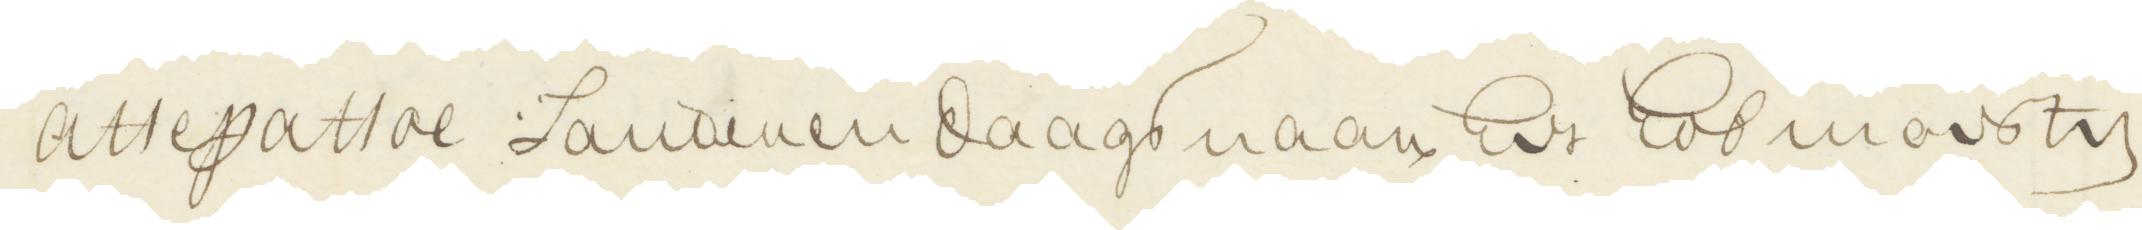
attepattoe sandiren daags naar het hof moesten
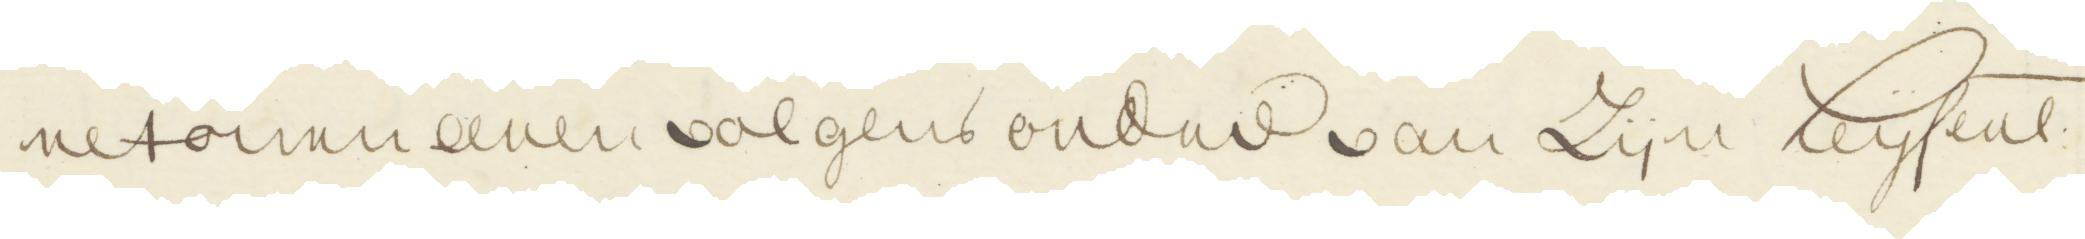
retourneeren volgens ordre van zijn keijserl:
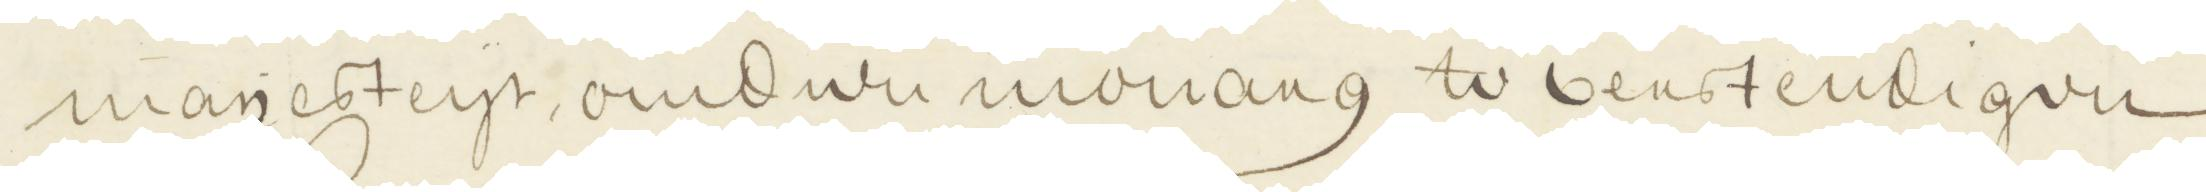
maijesteijt, om dien monarg te verstendigen
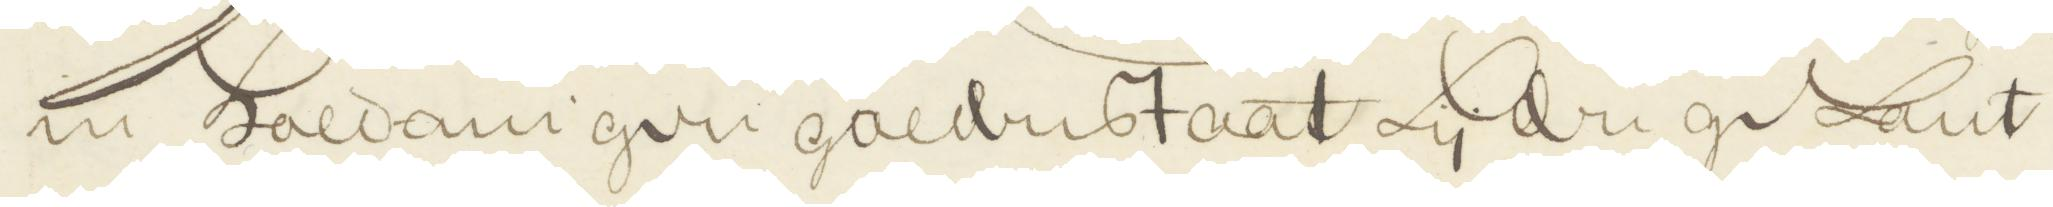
in hoedanigen goeden staat sijden gelant
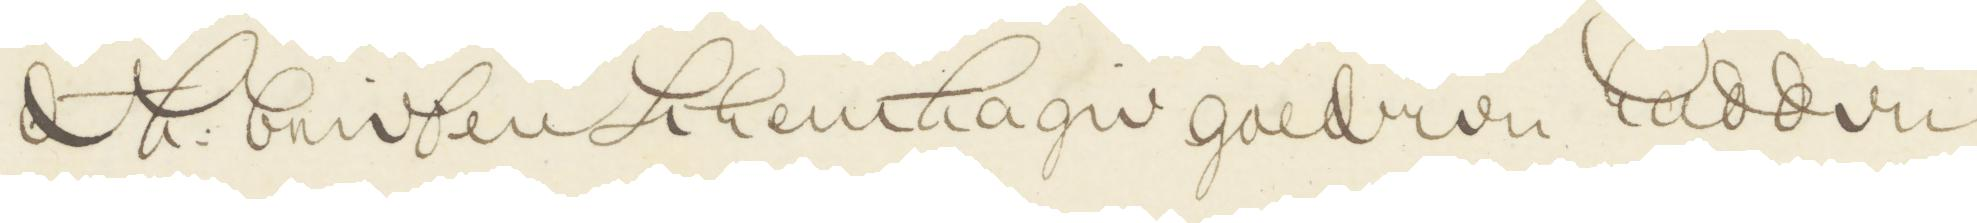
de k: briefen schenckagie goederen hadden
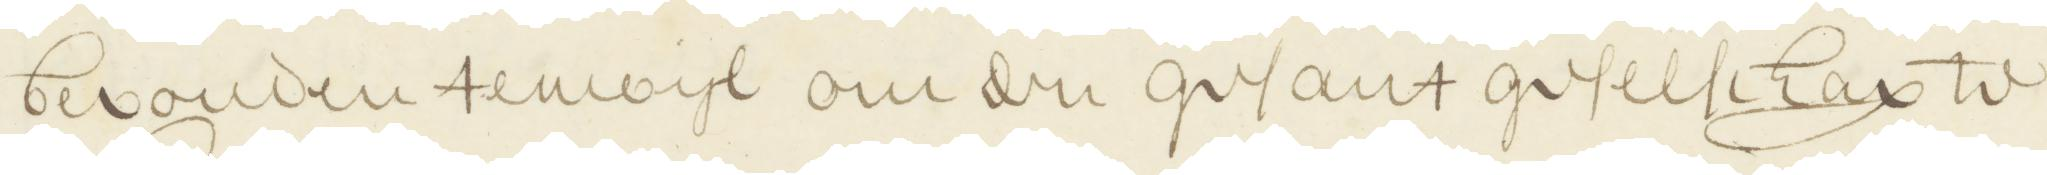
bevonden terwijl om den gesant geselschap te
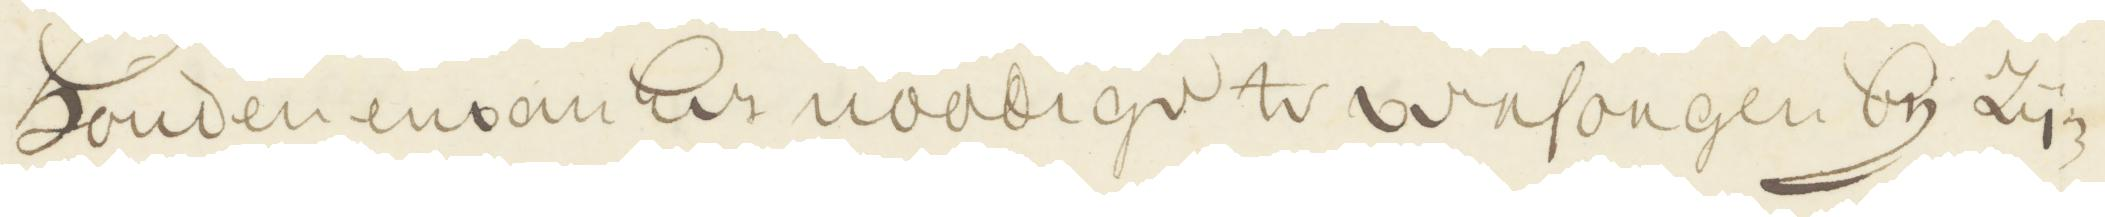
houden en van het noodige te versorgen by zijn
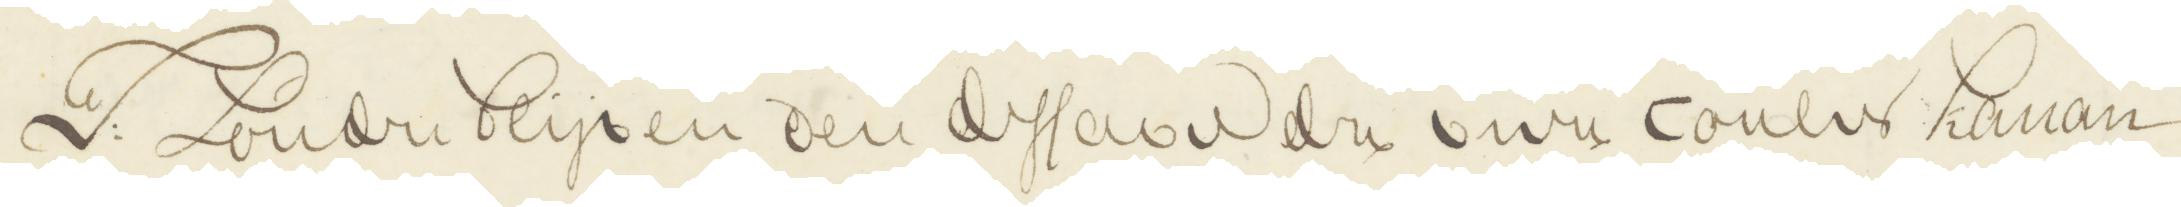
E: souden blijven den dessave der vier corles kanan
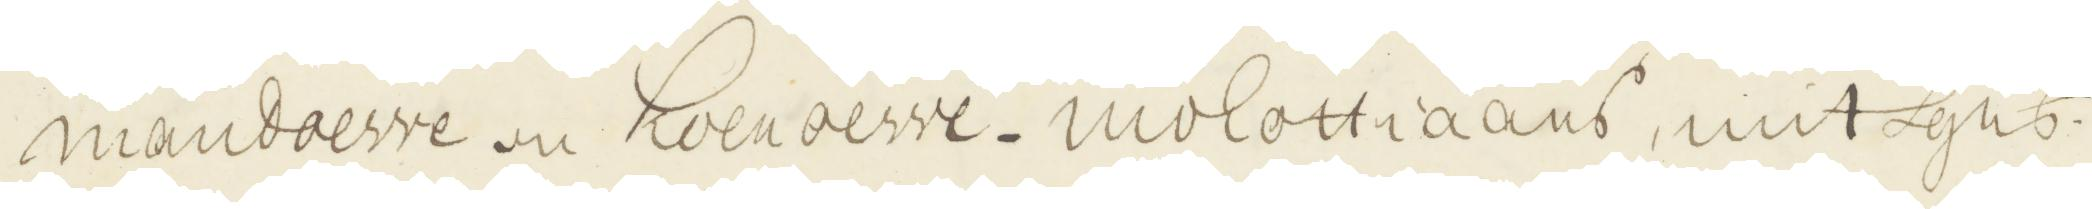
mandoewe en koeroewe- mohottiaars, mitsgrs.
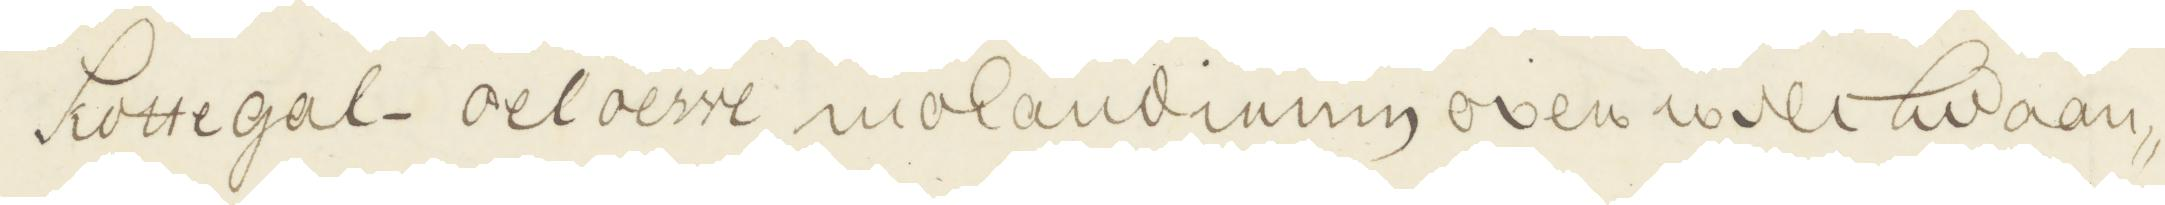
kottegal-oeloewe mohandirum over welcke aan„
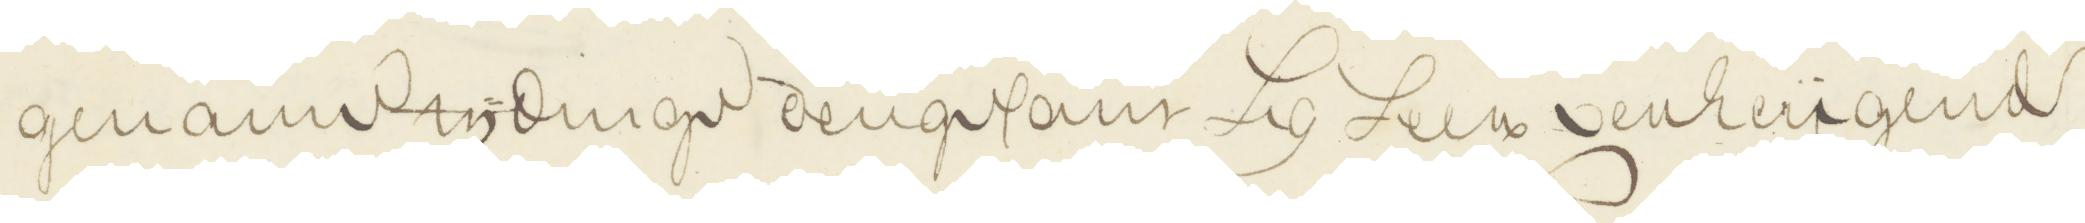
gename tijdinge den gesant sig seer verheugende
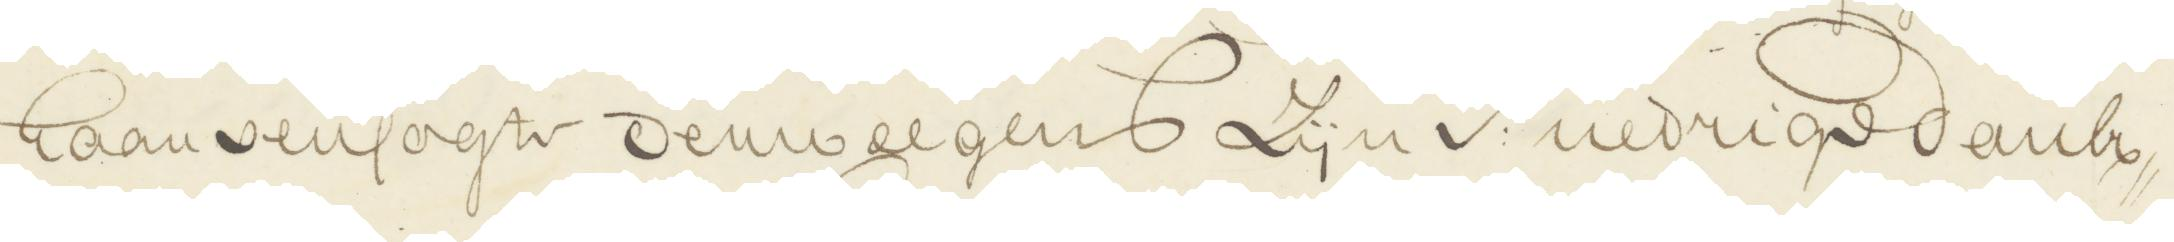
haar versogte derweegens zijn E:s nedrige dank„
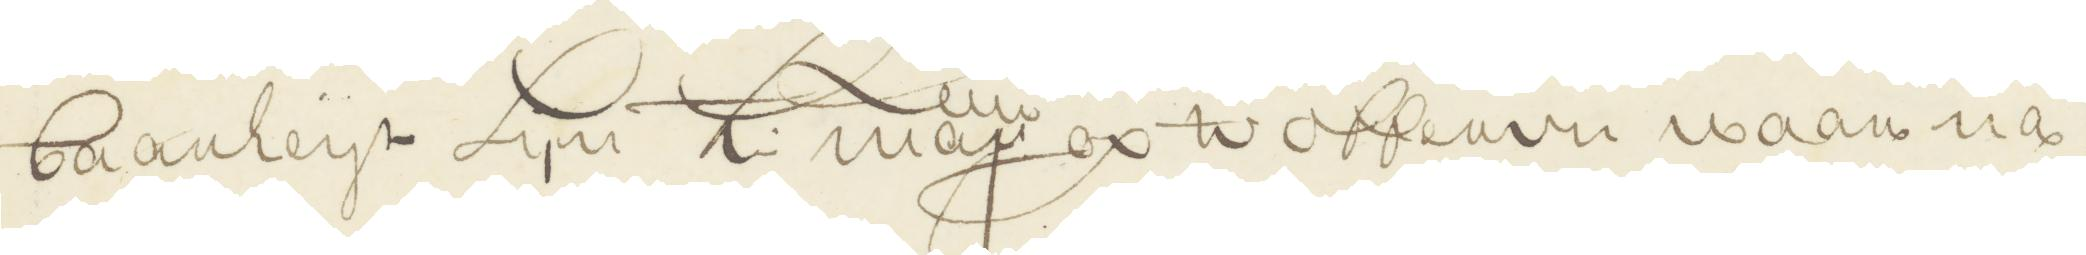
baarheijt zijn k: majen op te offeren waar na
